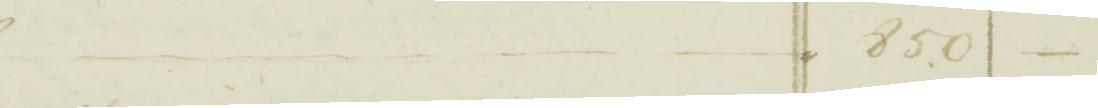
850 —
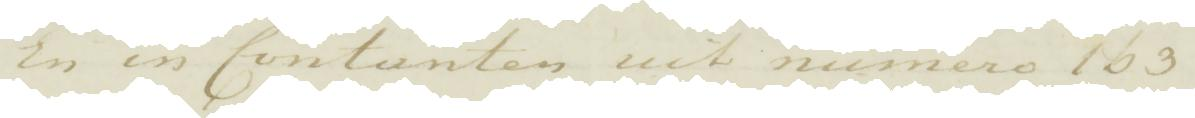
En in Contanten uit numero 163
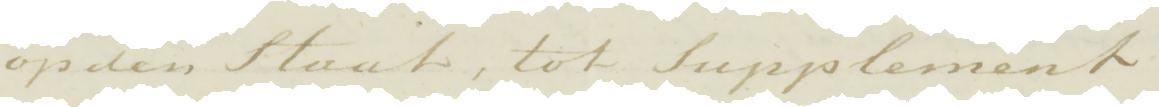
op den staat, tot supplement
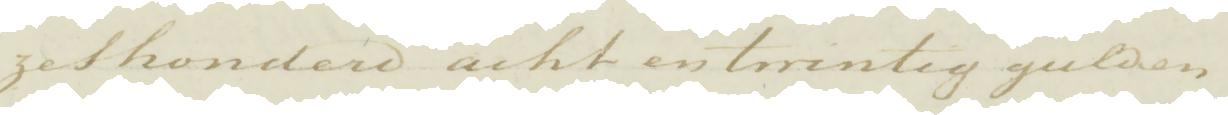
zes honderd acht en twintig gulden
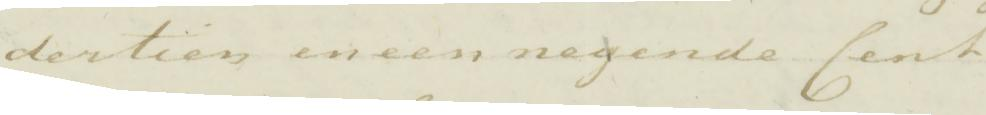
dertien en een negende Cent
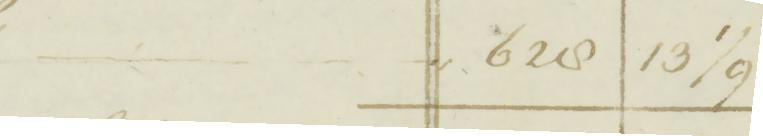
628 13 1/9
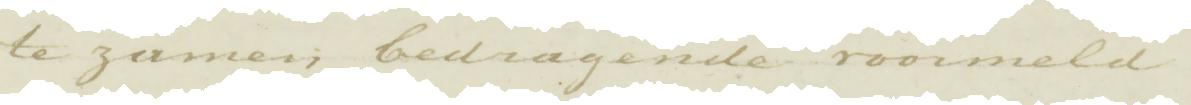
te zamen bedragende voormeld
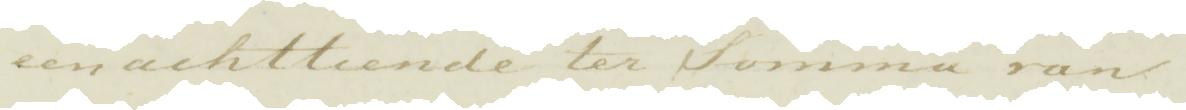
een achttiende ter somma van
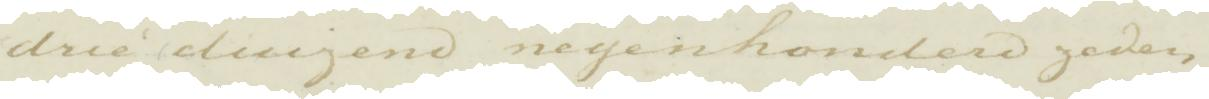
drie duizend negenhonderd zeven
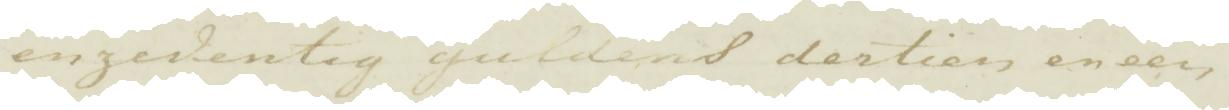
en zeventig guldens dertien en een
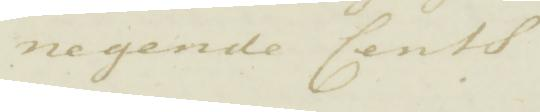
negende Cents
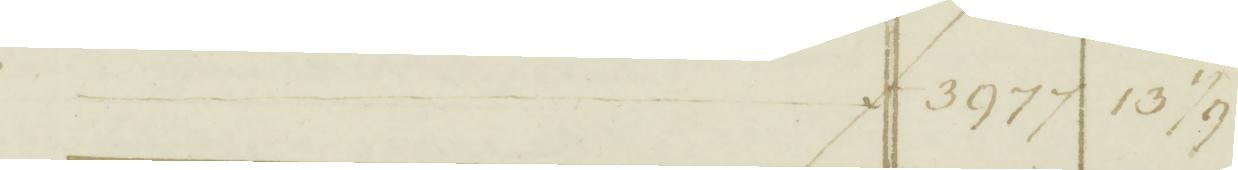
ƒ 3977 13 1/9
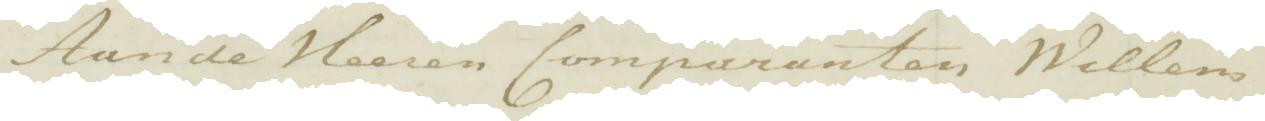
Aan de Heeren Comparanten Willem
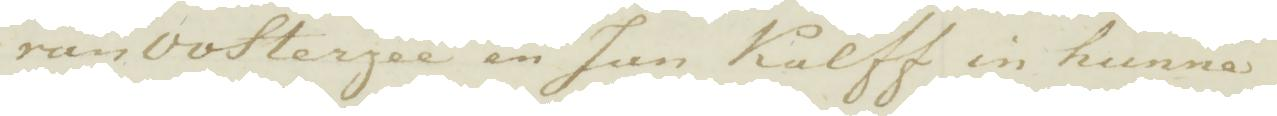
van Oosterzee en Jan Kalff in hunne
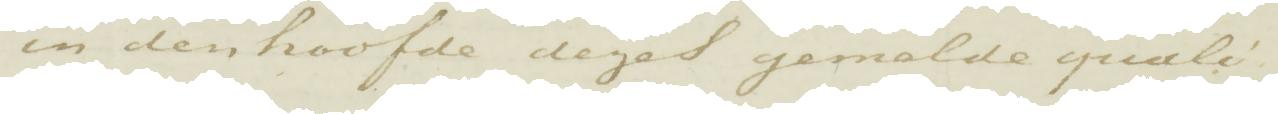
in den hoofde dezes gemelde quali
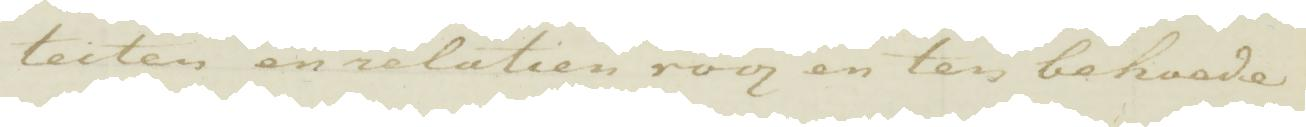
teiten en relatien voor en ten behoeve
